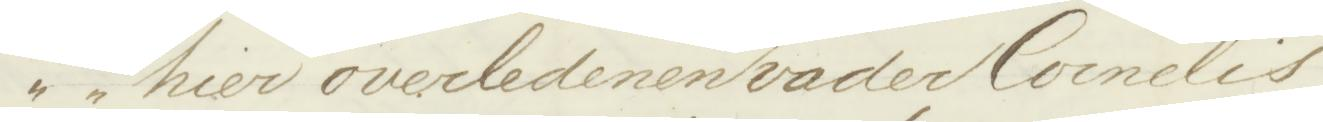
„ „hier overledenen vader Cornelis
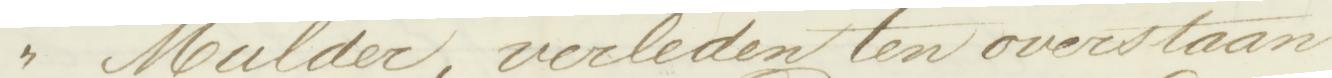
„Mulder, verleden ten overstaan
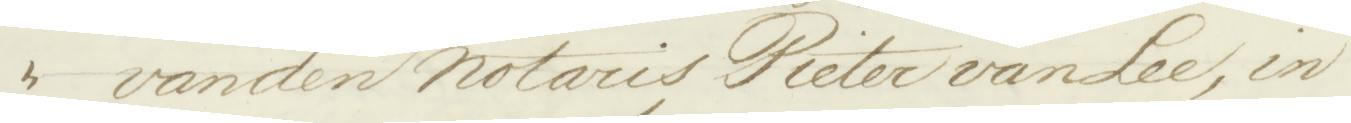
„ van den notaris Pieter van Lee, in
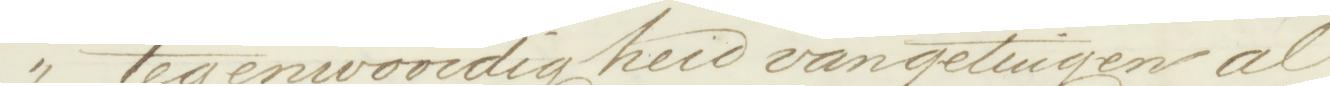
„ tegenwoordig heid van getuigen al
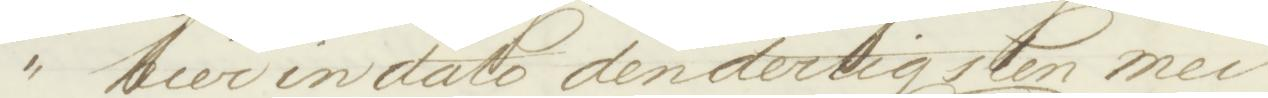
„ hier in dato den dertigsten mei
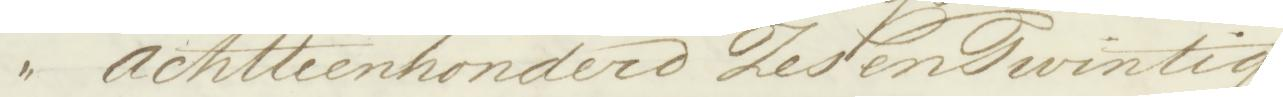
„ achttienhonderd Zes en Twintig
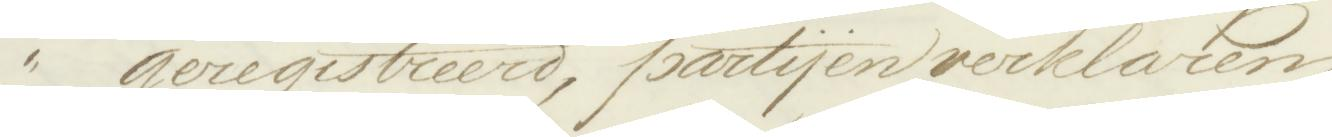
„ geregistreerd, partijen verklaren
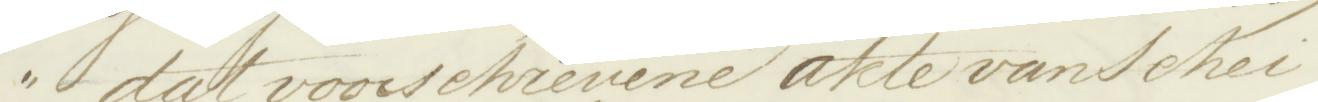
„ dat voorschrevene akte van schei
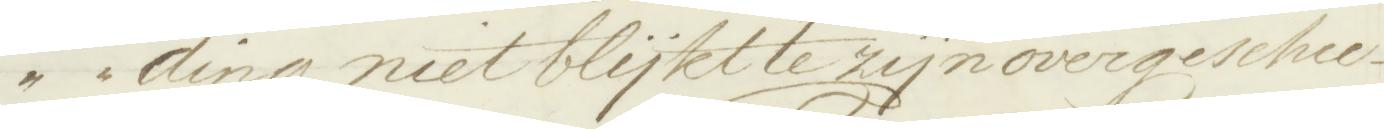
„ „ding niet blijkt te zijn overgeschre
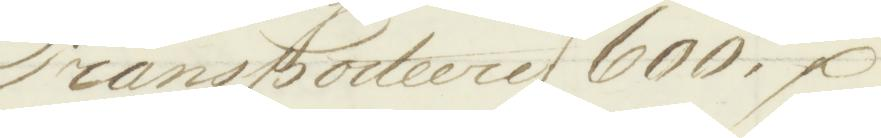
Transporteere ƒ 600, /
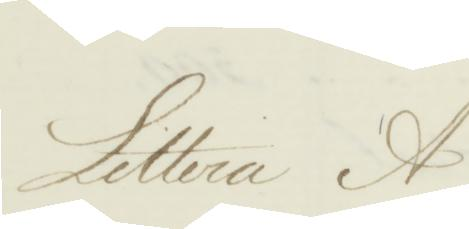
Littera A
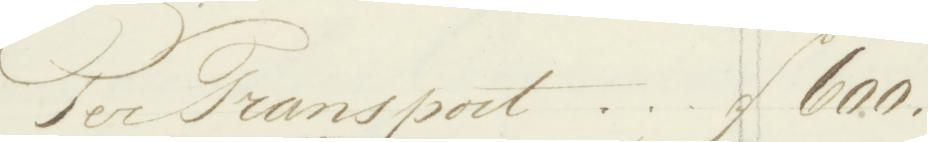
Per Transport . . . ƒ 600,
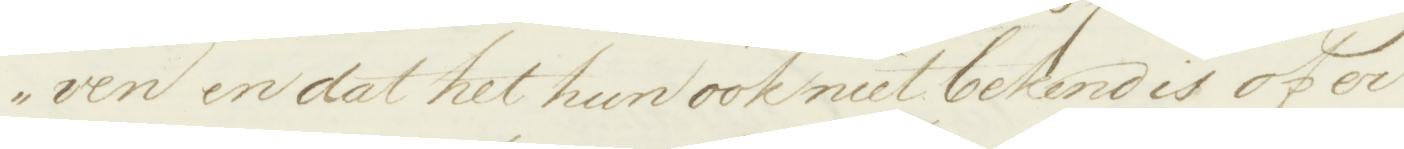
„ven en dat het hun ook niet bekend is of er
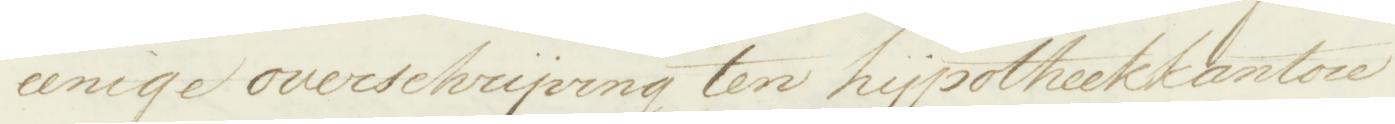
eenige overschrijving ten hijpotheekkantore
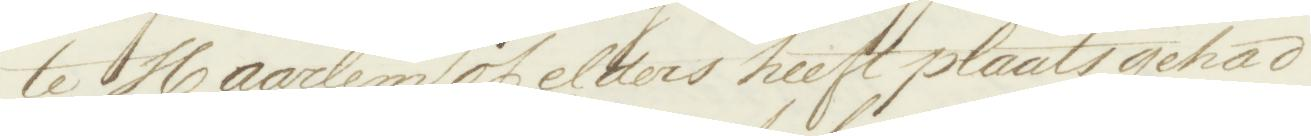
te Haarlem of elders heeft plaats gehad
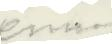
enz
